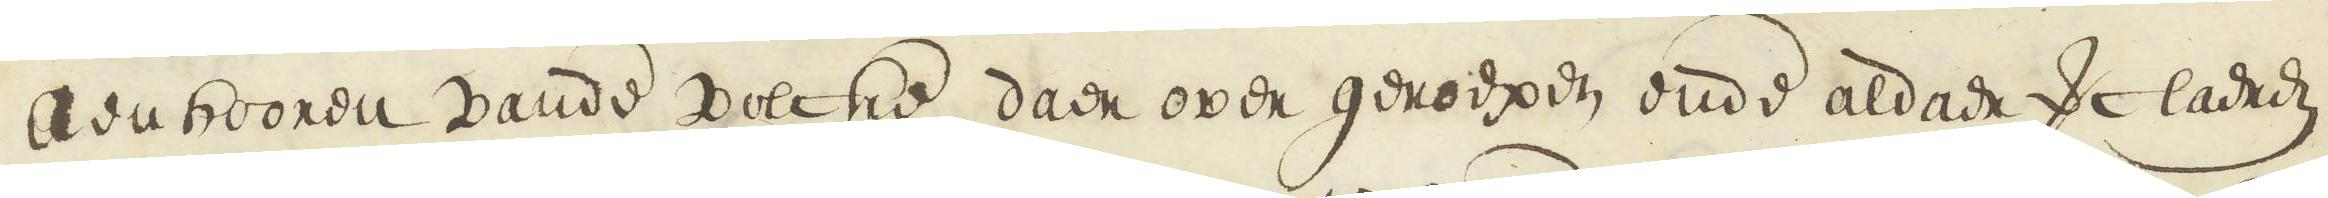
aenhooren vande volcke daer over geroepen ende aldaer verclaeren
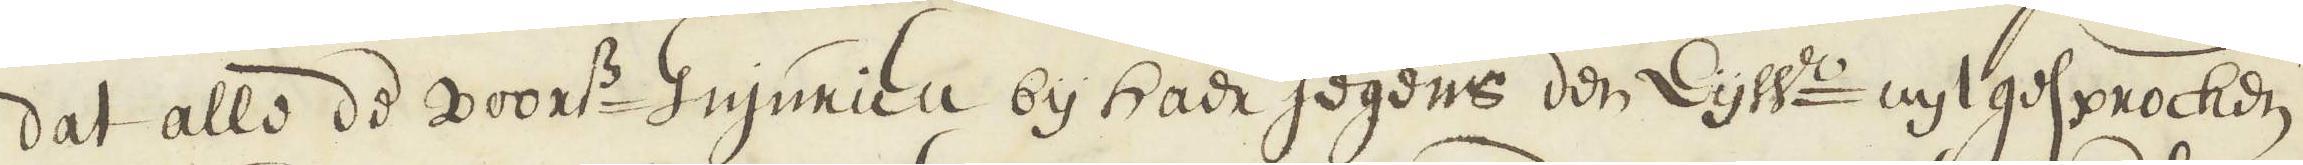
dat alle de voors=z Injurien bij haer jegens den Eijss=r uyt gesprocken
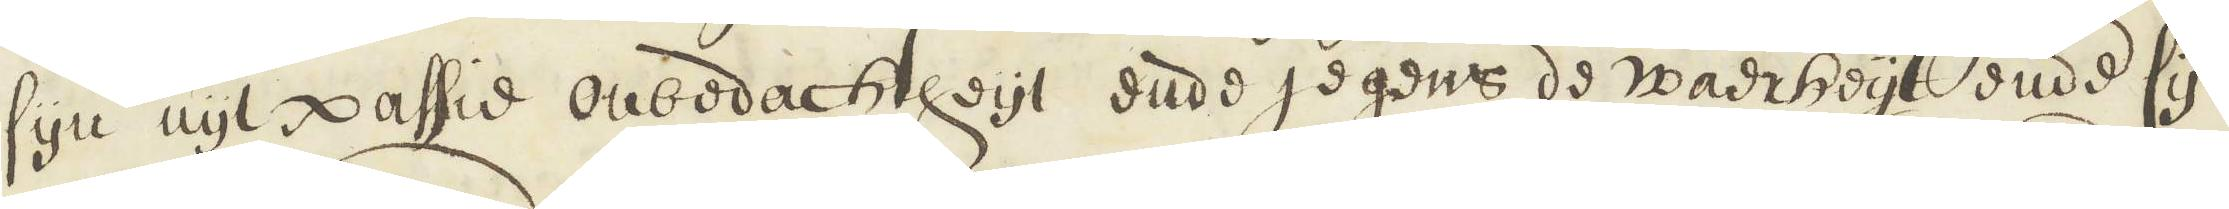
sijn uijt passie ongedachtheijt ende jegens de waerheijt ende sij
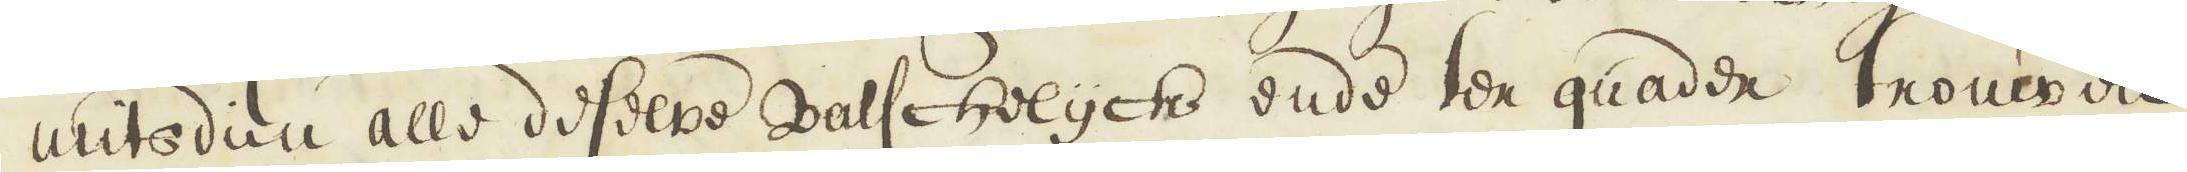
mitsdien alle deselve valschelijck ende ter quader trouwen
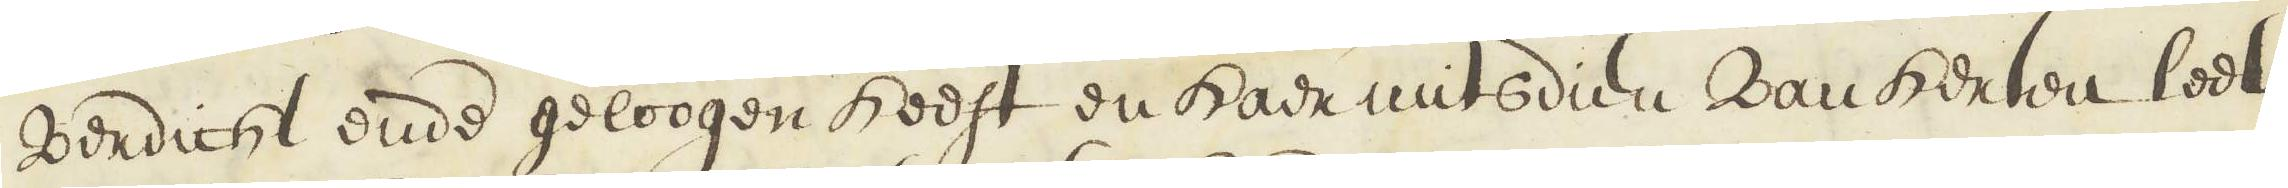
verdicht ende geloogen heeft en haer mitsdien van herten leet
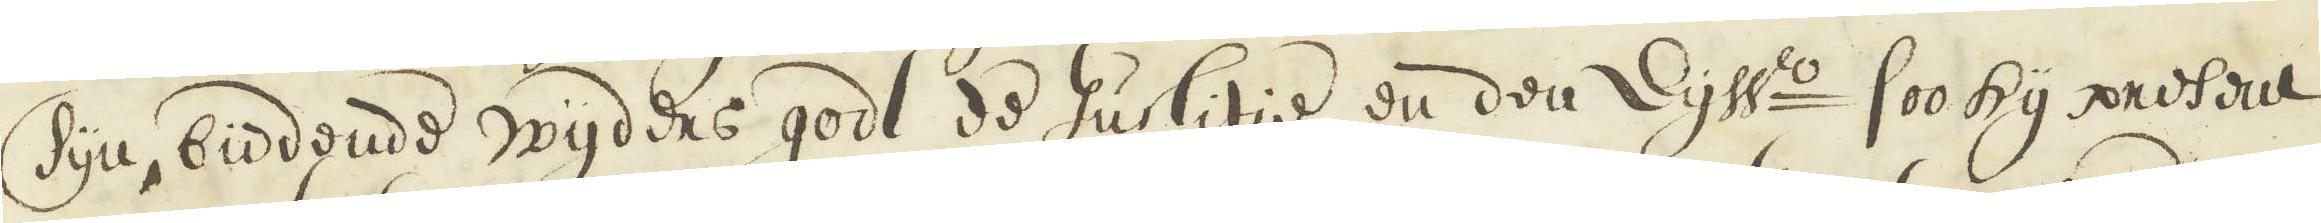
sijn, biddende wijders godt de Justitie en den Eijss=r soo hij present
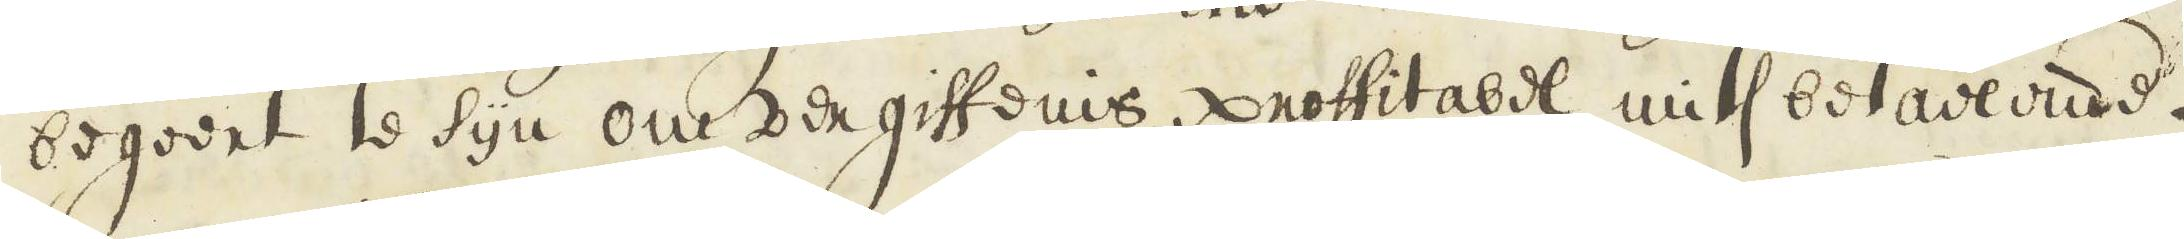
begeert te sijn om vergiffenis, proffitabel mits betaelende
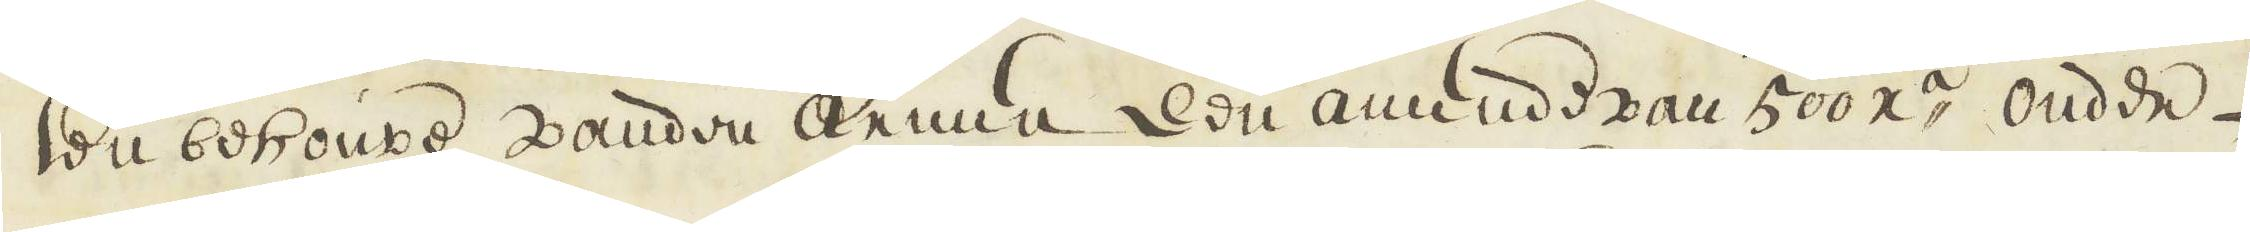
ten behouve vanden Armen Een amende van 500 r„a onder -
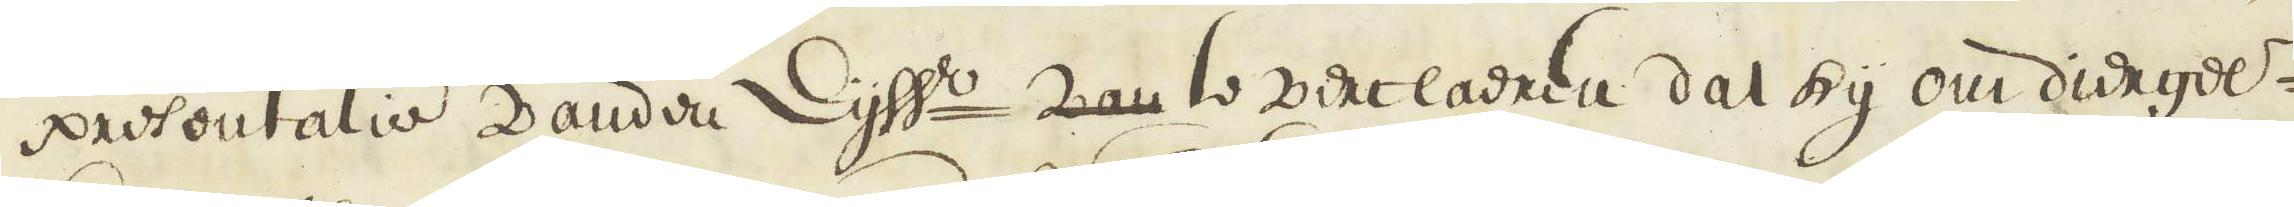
presentatie vanden Eijss=r van te verclaeren dat hij om diergel
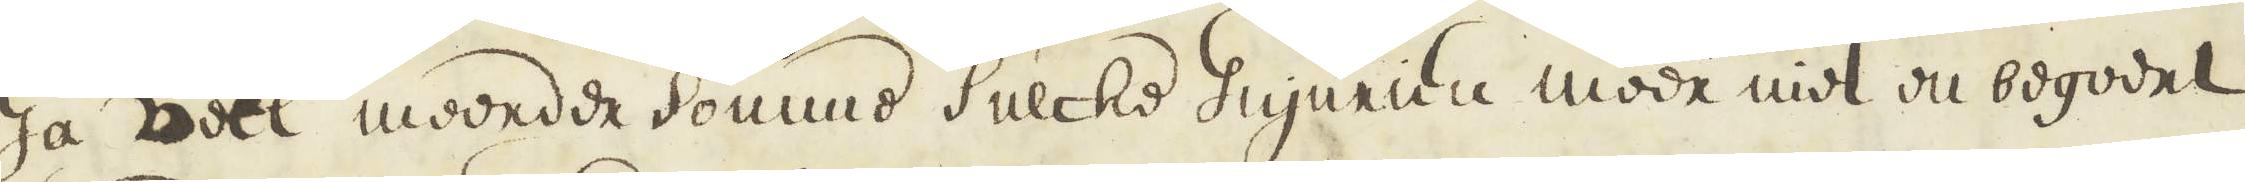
Ja wel meerder somme sulcke Injurien meer niet en begeert
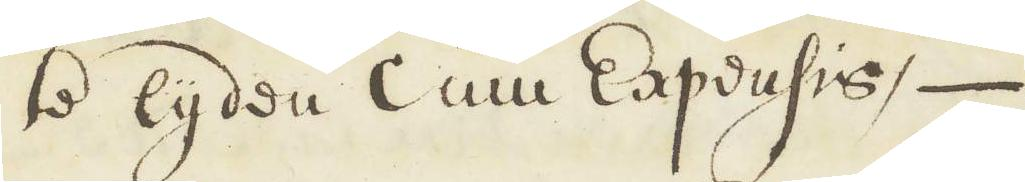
te lijden Cum Expensis/ —
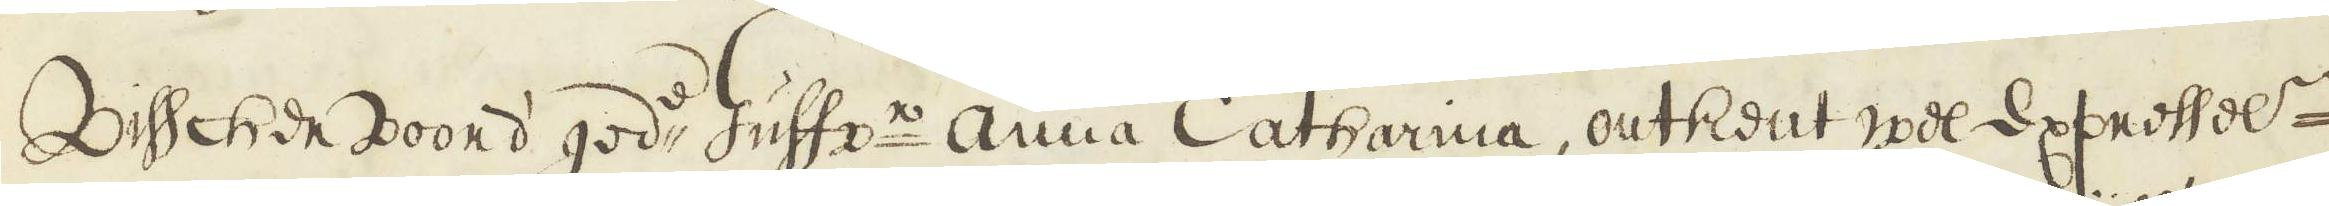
Visscher voor d’ ged„e Juffv=r Anna Catharina, ontkent wel Expressel=
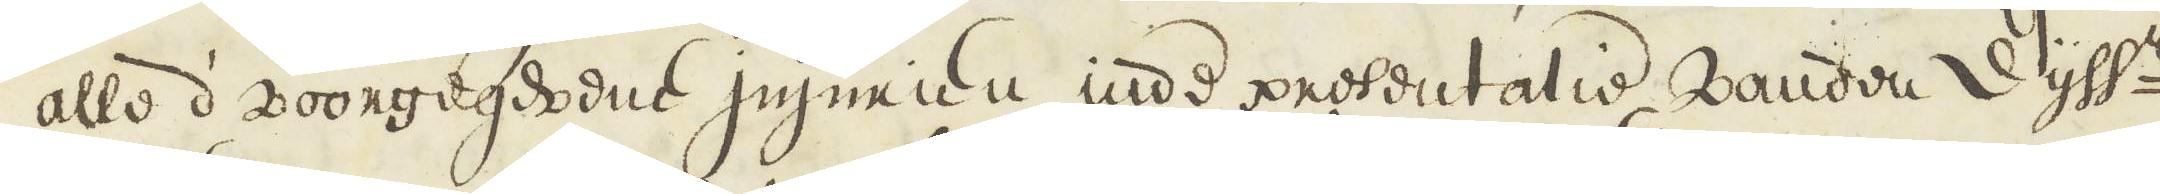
alle d’ voorgegevene jnjurien inde presentatie van den Eijss=r
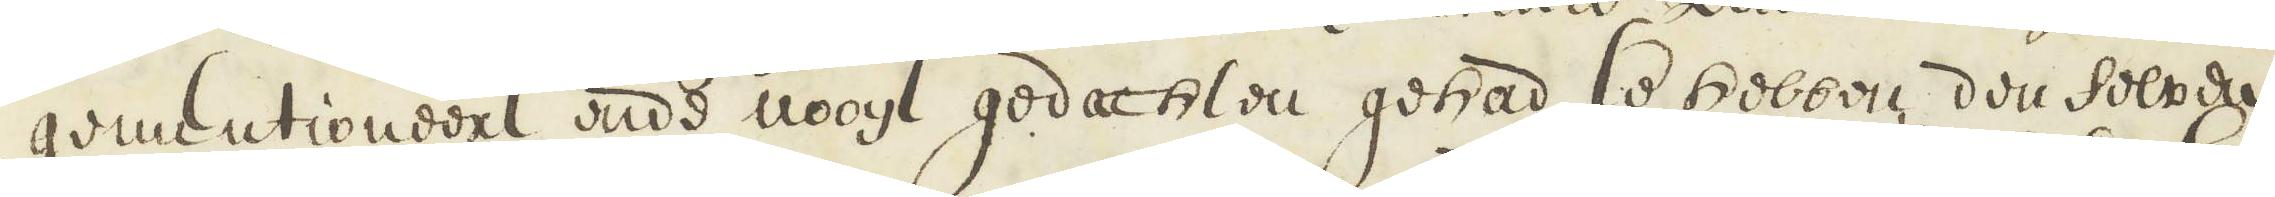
gementioneert, ende nooyt gedachten gehad te hebben den selven
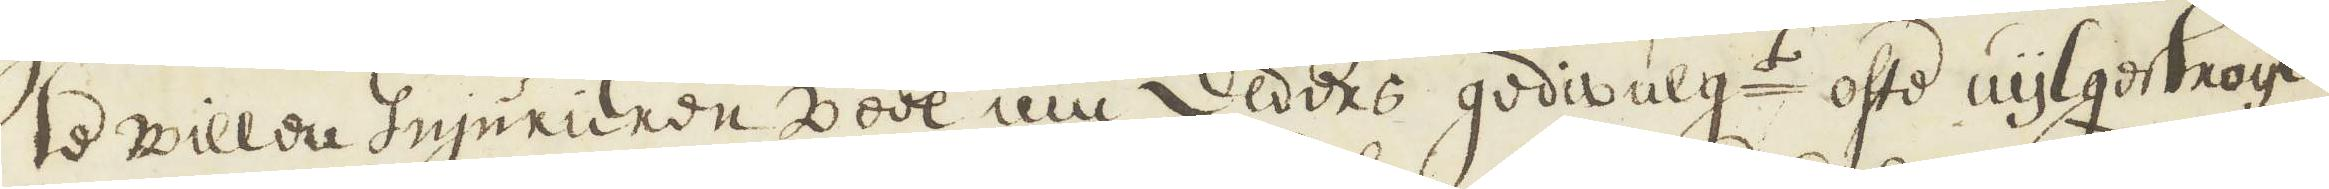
te willen Injurieren veel nin Elders gedivulg=t ofte uijtgestroijt
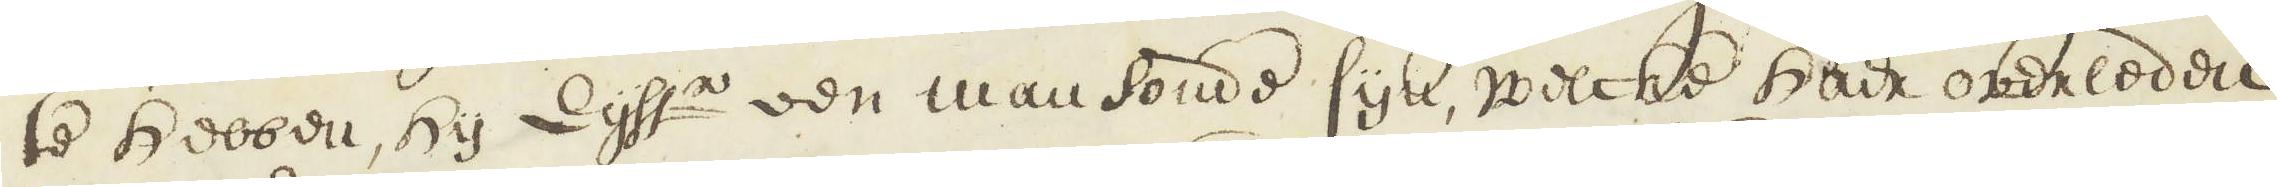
te hebben, hij Eijss=r een man soude sijn, welcke haer overleden
